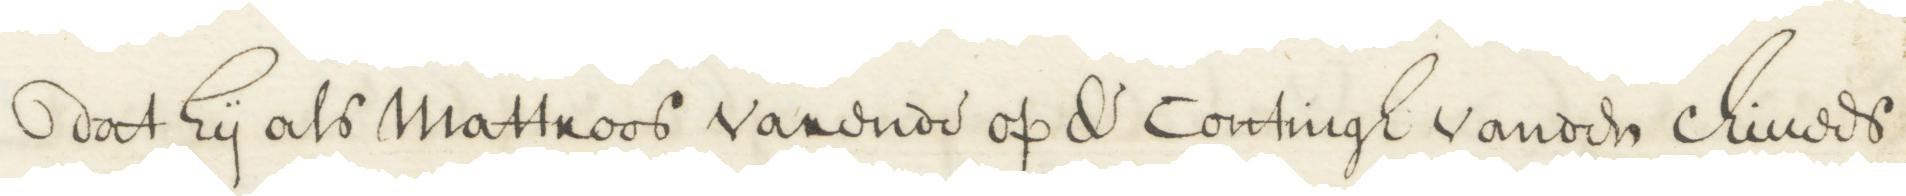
dat hij als Mattroos varende op de Contingh vanden Chinees
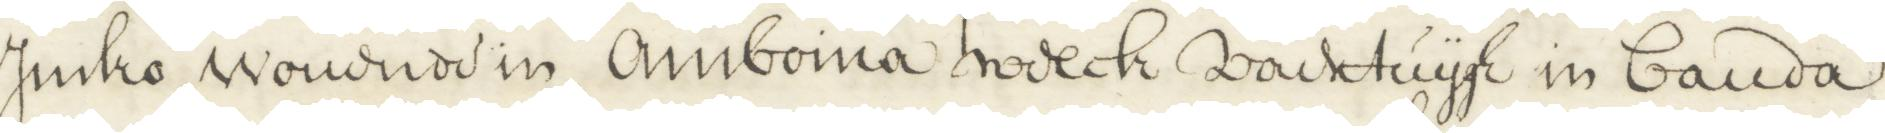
Jmko wonende in Amboina welck vaertuijgh in banda
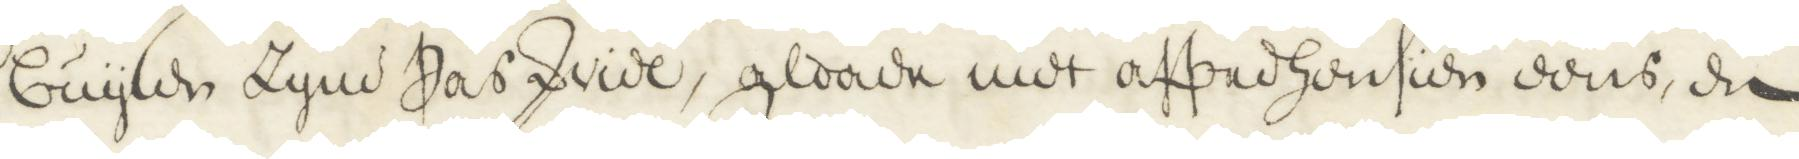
buijten zyne pas verviel, aldaer met apprehensien eens, en
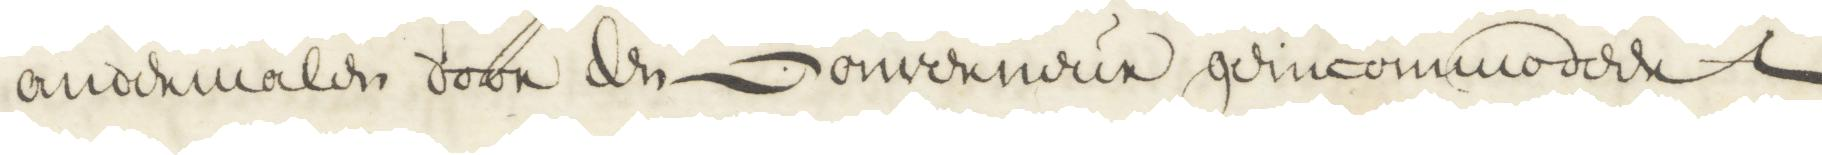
andermalen door den Gouverneur geincommodeert
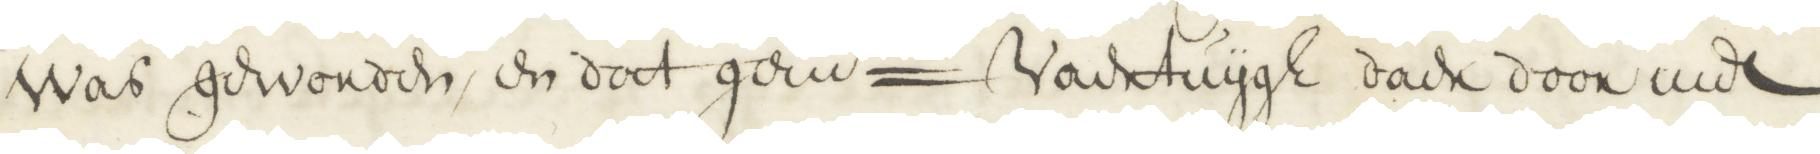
was geworden, en dat gem=ten vaertuijgh daer door met
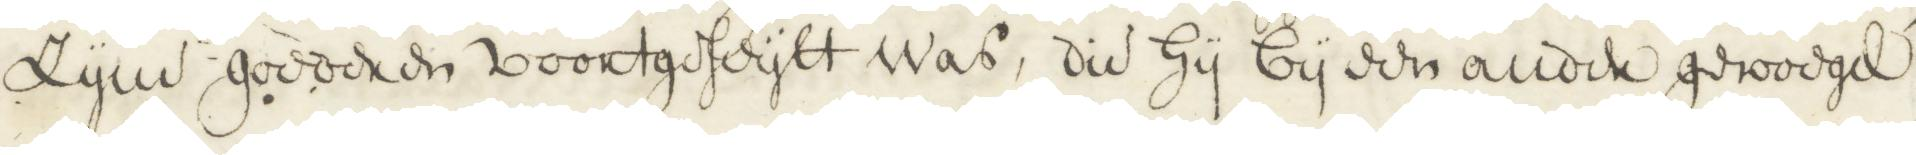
zijne goederen voortgeseijlt was, die hij bij een ander gevoegde
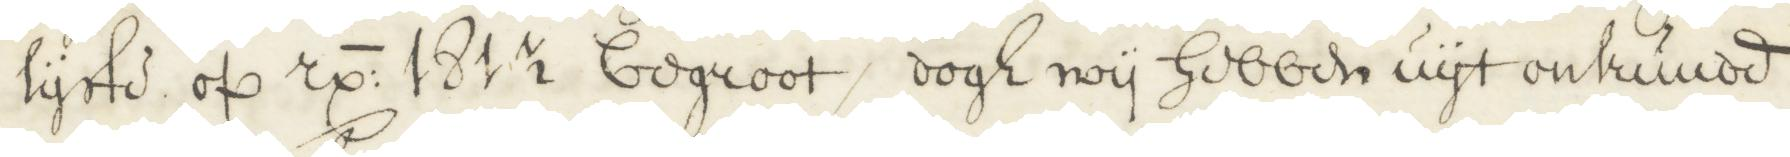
lijste op rx: 181½ begroot, dogh wij hebben uijt onkunde
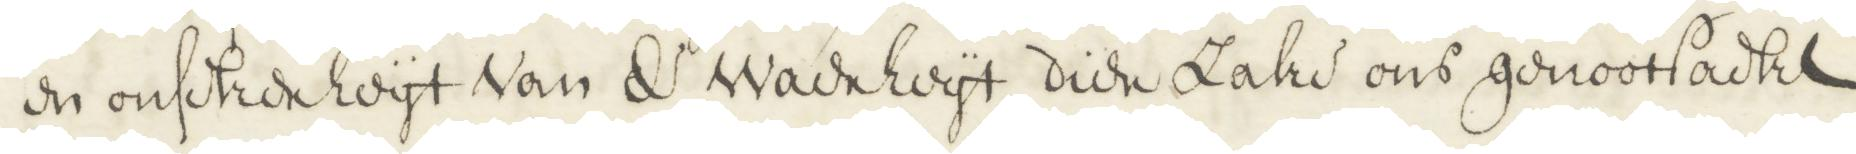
en onsekerheijt van de waerheijt dier zake ons genootsaekt
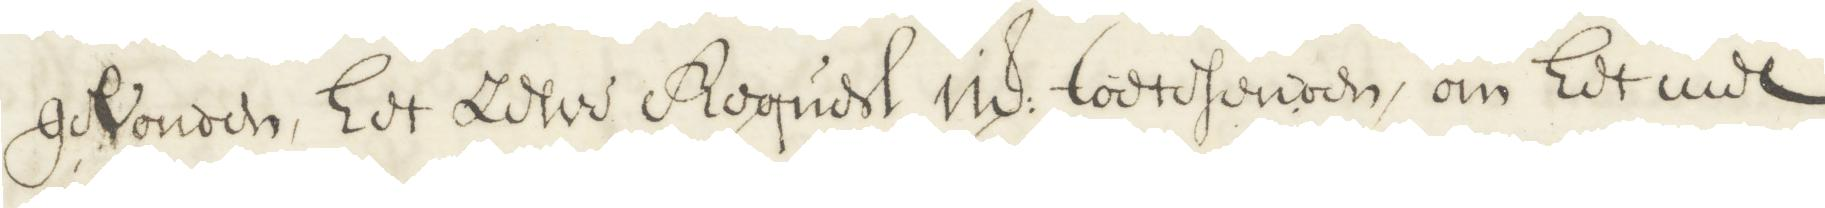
gevonden, het zelve Request UE: toetesenden, om het met
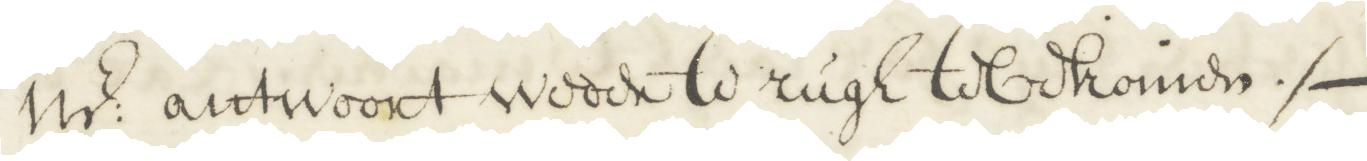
UE: antwoort weder te rugh tebekomen./—
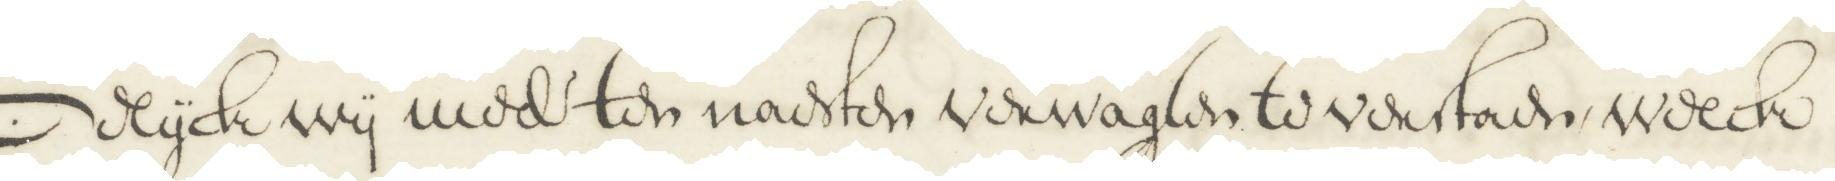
Gelijck wij mede ten naesten verwagten te verstaen, welck
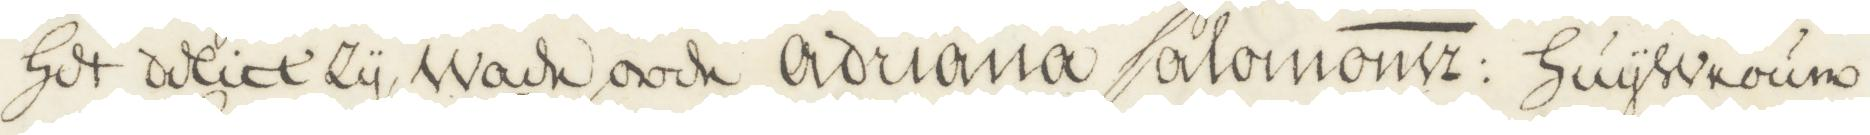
het delict zij, waer over adriana salomonsz: huijsvrouw
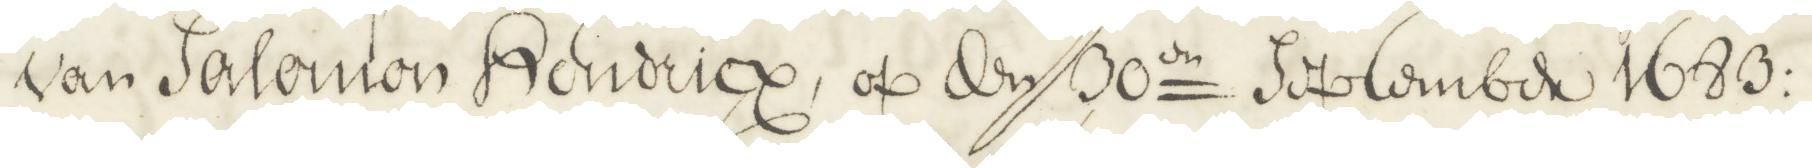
van Salomon Hendricx, op den 30=en September 1683:
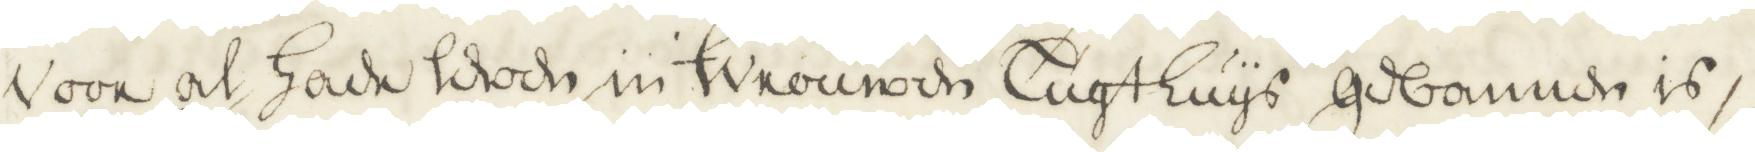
voor al haer leven in 'tvrouwen tugthuijs gebannen is,
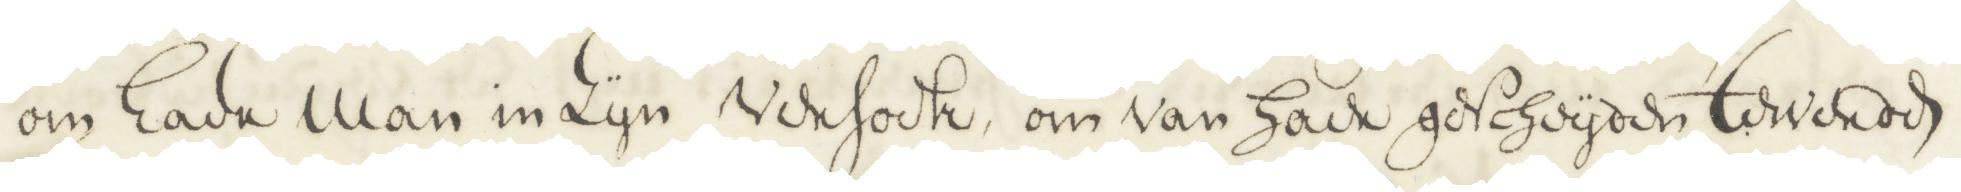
om haer man in zijn versoek, om van haer gescheijden tewerden
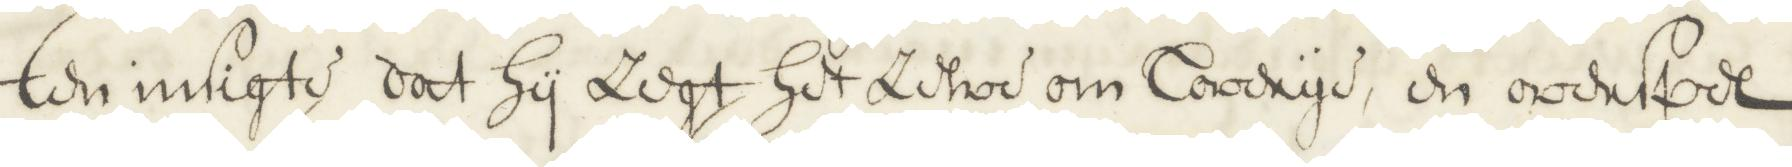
ten insigte dat hij zegt het zelve om Toverije, en overspel
